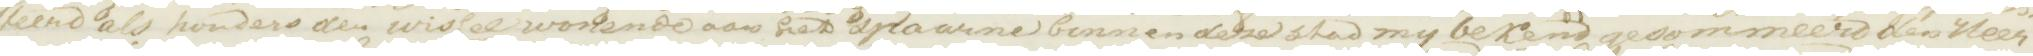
teerd als houders den wissel wonende aan het spaarne binnen deze stad my bekend gesommeerd den Heer
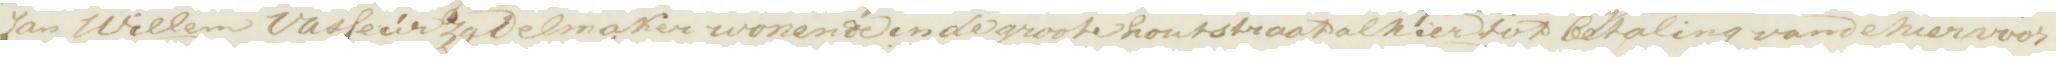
Jan Willem Vasseur zadelmaker wonende in de groote houtstraat alhier tot betaling vande hiervoor
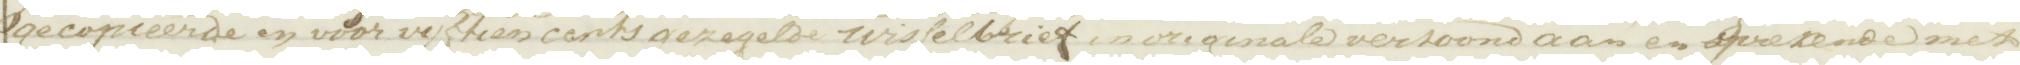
gecopieerde en voor vyftien cents gezegelde wisselbrief in originale vertoond aan en sprekende met
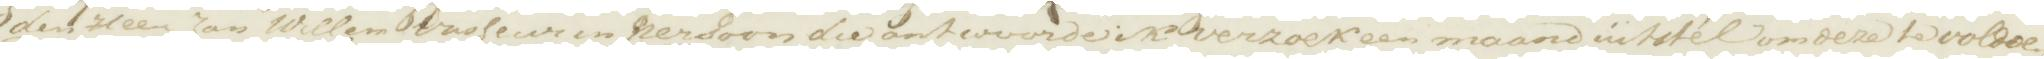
den Heer Jan Willem Vasseur in persoon die antwoorde ik verzoek een maand uitstel om deze te voldoen
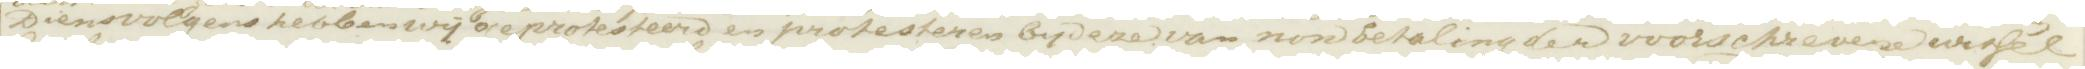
Diensvolgens hebben wij geprotesteerd en protesteren by deze van non betaling der voorschrevene wissel
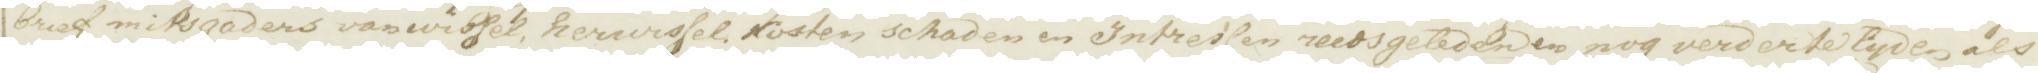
brief mitsgaders van wissel, herwissel, kosten schaden en Intressen reeds geleden en nog verder te lyden als
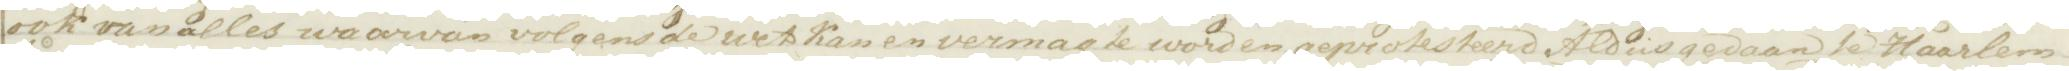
ook van alles waarvan volgens de wet kan en vermag te worden geprotesteerd Aldus gedaan te Haarlem
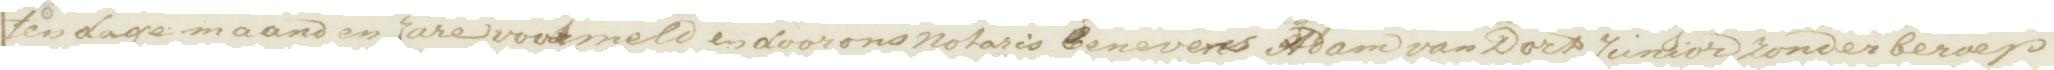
ten dage maand en Jare voormeld en door ons notaris benevens Adam van Dort Junior zonder beroep
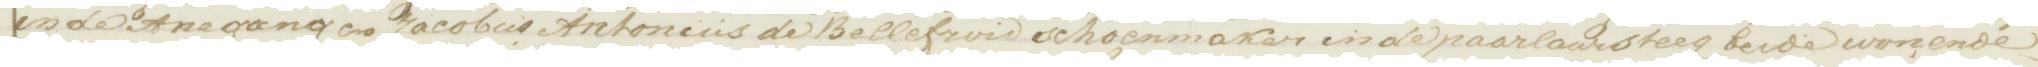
in de Anegang en Jacobus Antonius de Bellefroid schoenmaker in de paarlaarsteeg beide wonende
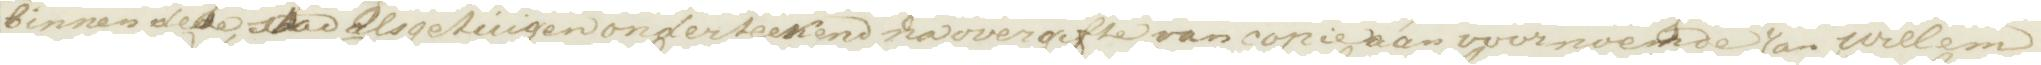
binnen dese stad als getuigen onderteekend na overgifte van copie van voornoemde Jan Willem
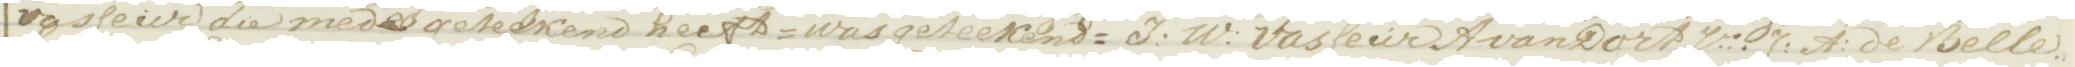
Vasseur die mede geteekend heeft = was geteekend = I: W: Vasseur A van Dort J„r J: A: de Belle„
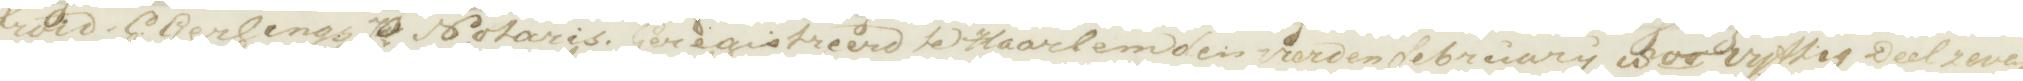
froid, C Gerlings J„r Notaris. Geregistreerd te Haarlem den vierden februarij 1800 vyftig Deel zeven
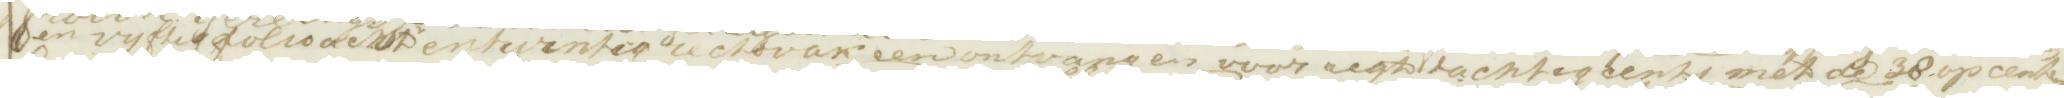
en vyftig folio acht en twintig recto vak een ontvangen voor regt tachtig cents met de 38. op centen
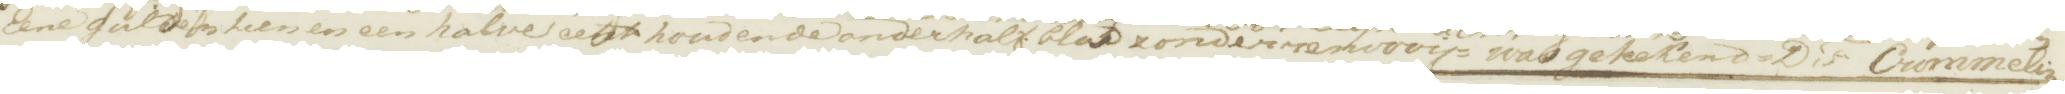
Eene gulden tien en een halve cent houdende anderhalf blad zonder renvooij = was getekend = D F Crommelin
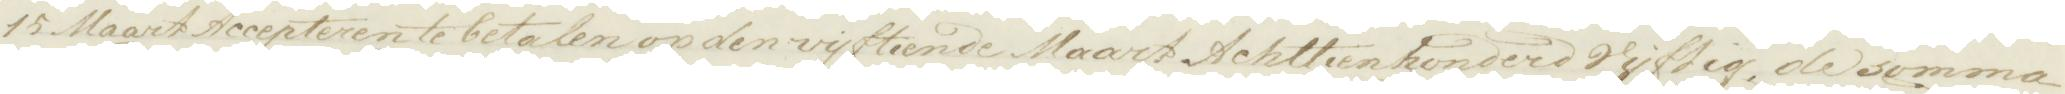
15 Maart Accepteren te betalen op den vijftiende Maart Achttienhonderd Vijftig, de somma
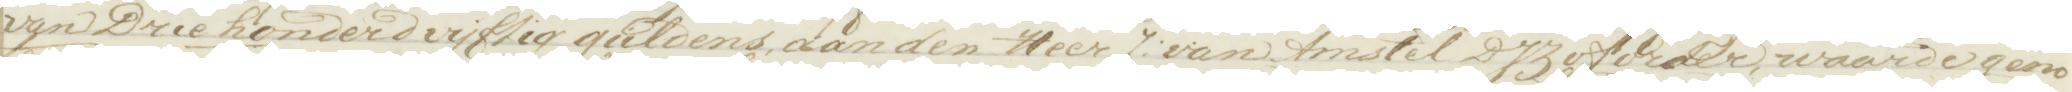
van Drie honderd vijftig guldens, aan den Heer J: van Amstel D73 of order, waarde geno
